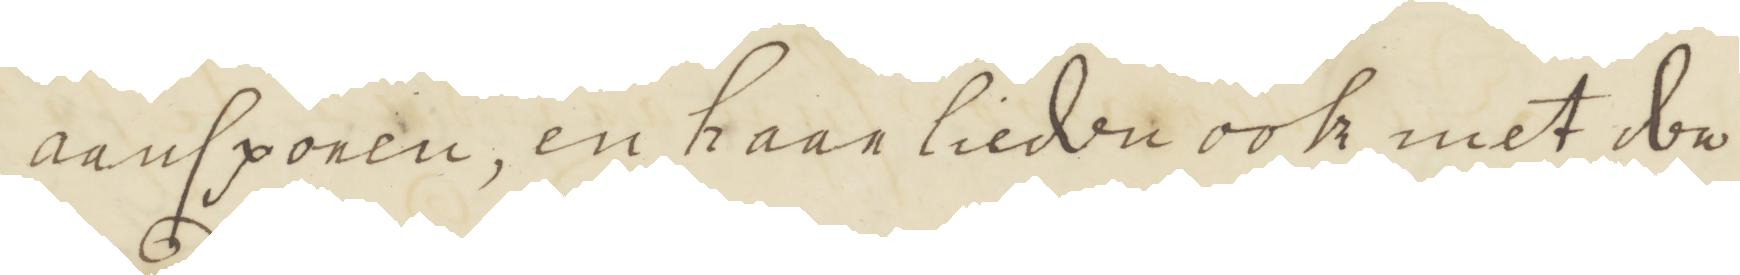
aansporen, en haar lieden ook met der
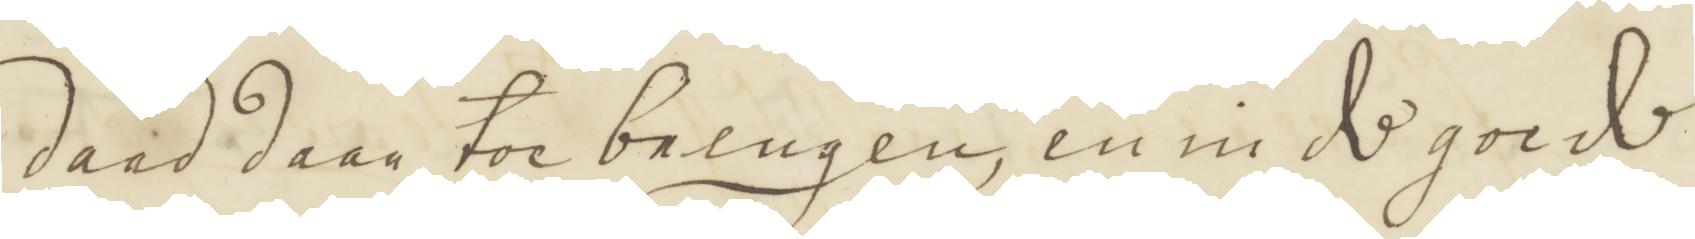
daad daar toe brengen, en in de goede
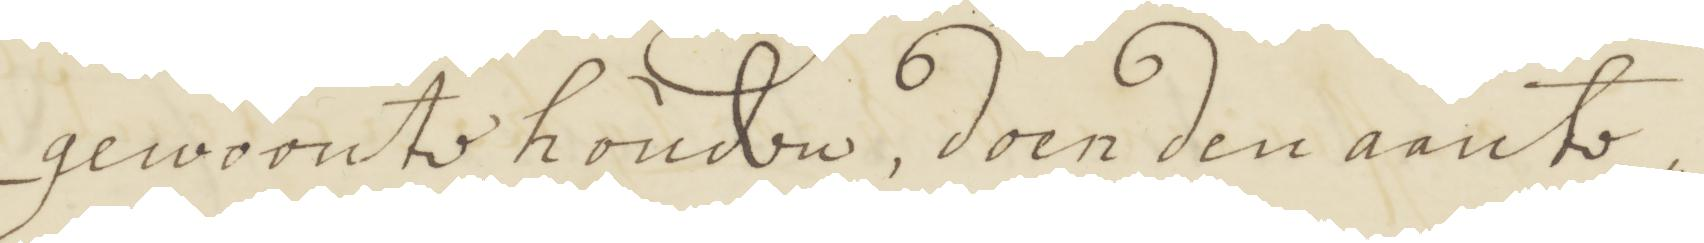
gewoonte houden, doen den aante„
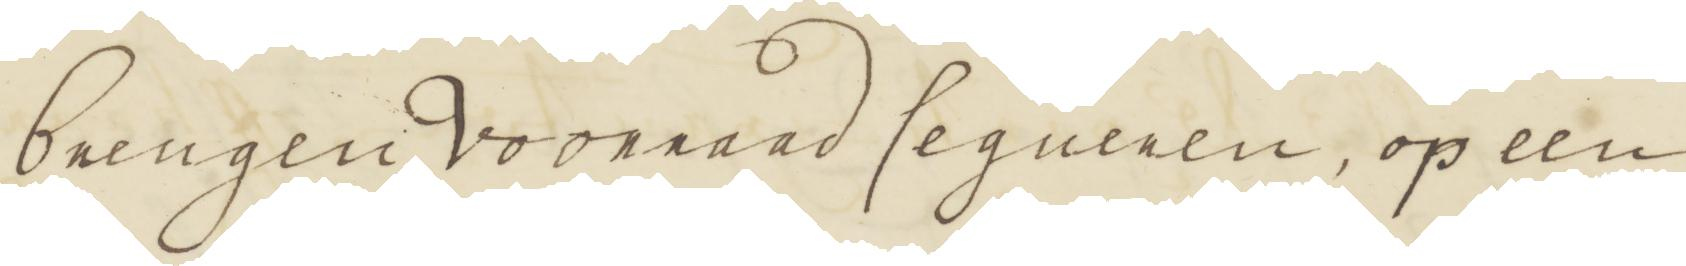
brengen voorraad segueren, op een
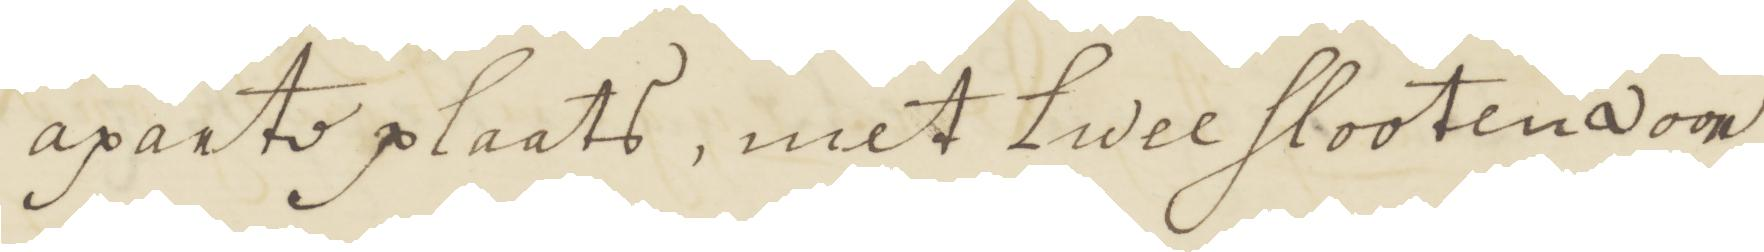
aparte plaats, met twee slooten voor
